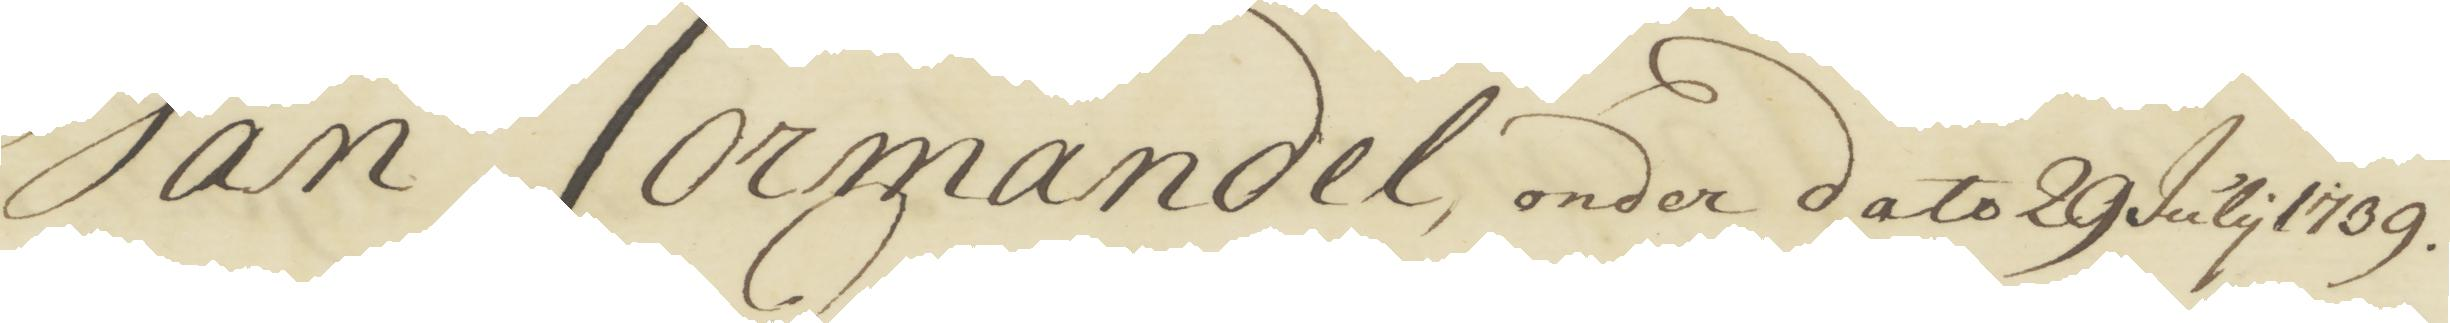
Van Cormandel, onder dato 29 Iulij 1739.
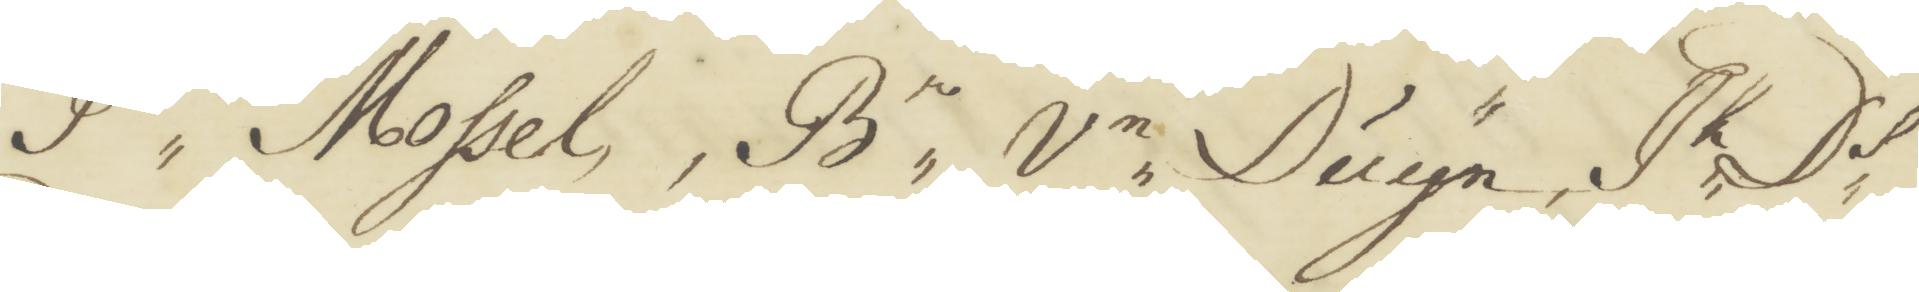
J„b Mossel, B„r V„n Duijn, I„k D„s.
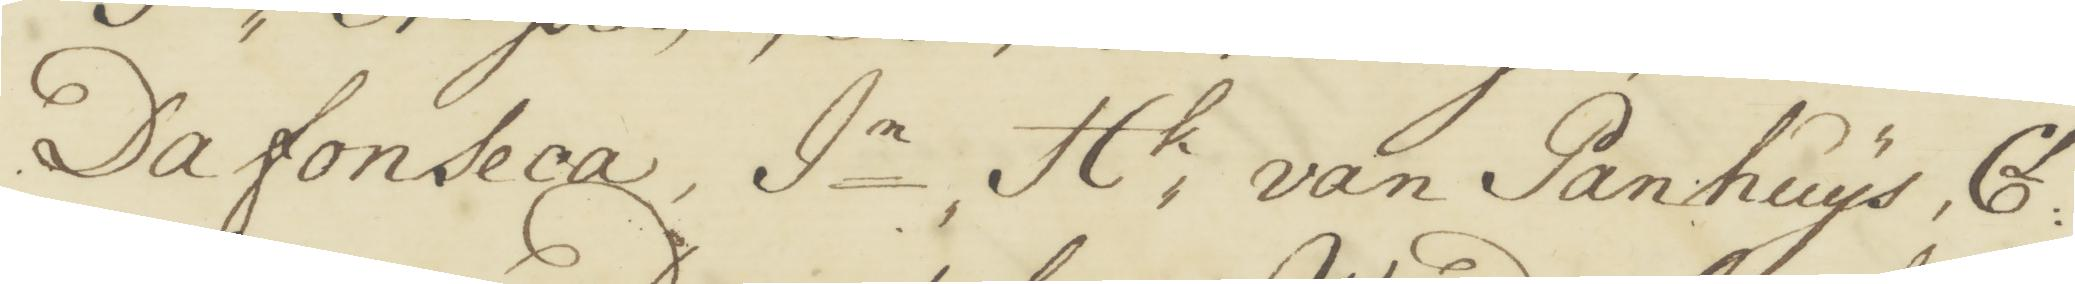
Da fonseca, I=n H„k van Panhuijs, C:l
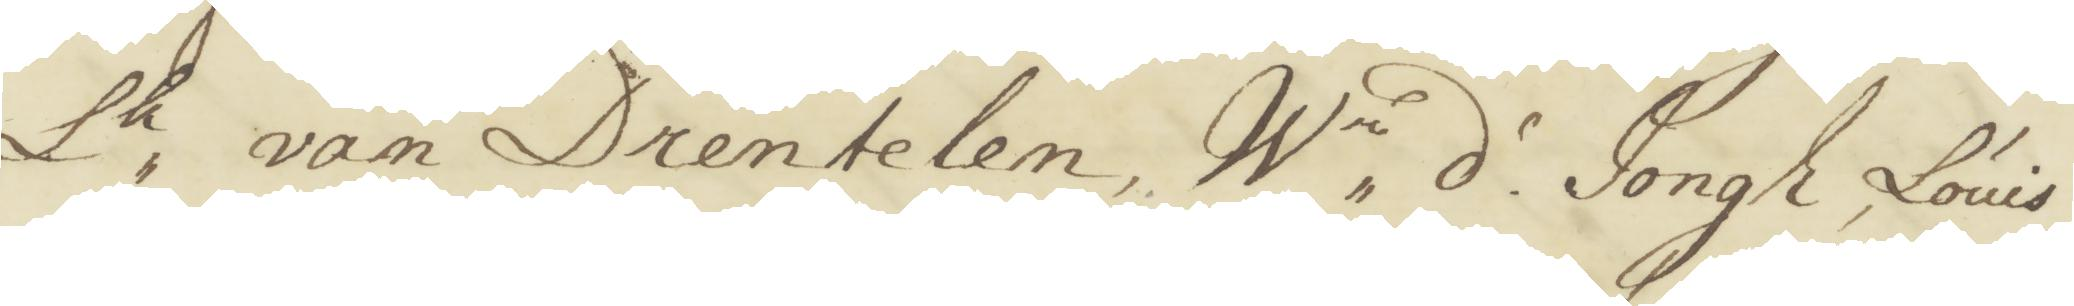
L„k van Drentelen, W„m d.o Iongh, Louis
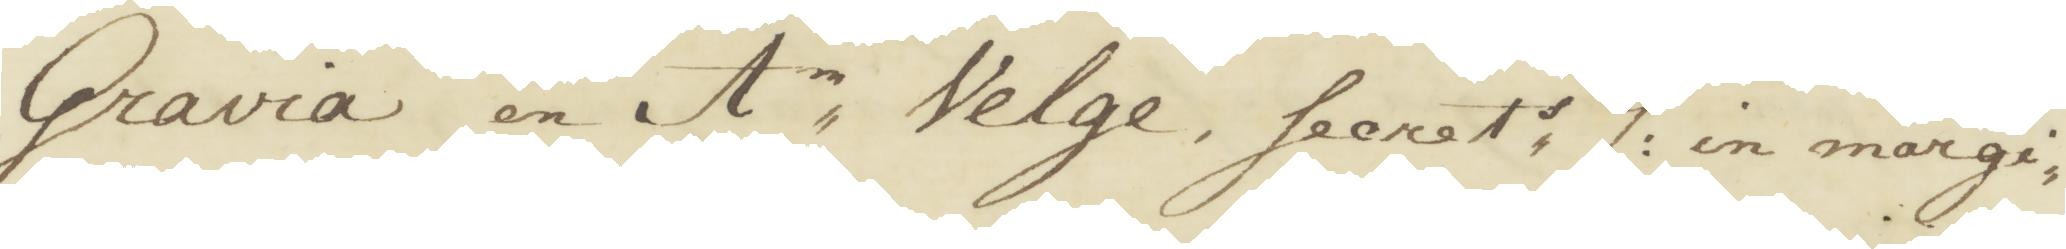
Gravia en A„m Velge, secret„s /: in margi„
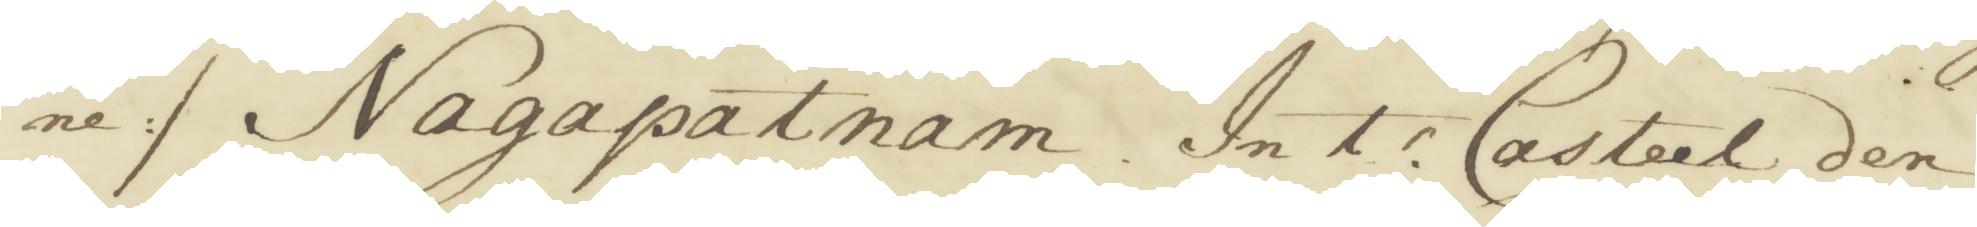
ne :/ Nagapatnam In t: Casteel den
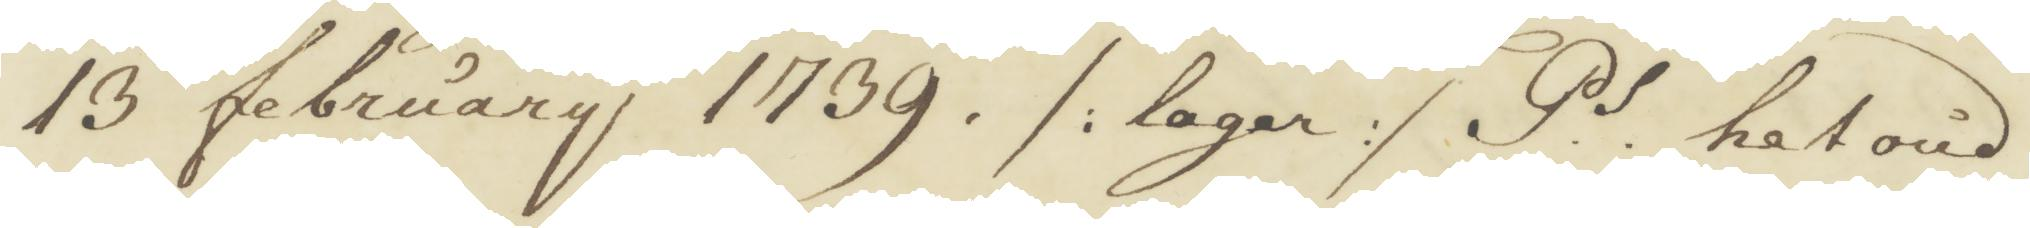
13 februarij 1739. /: lager :/ P:s het oud
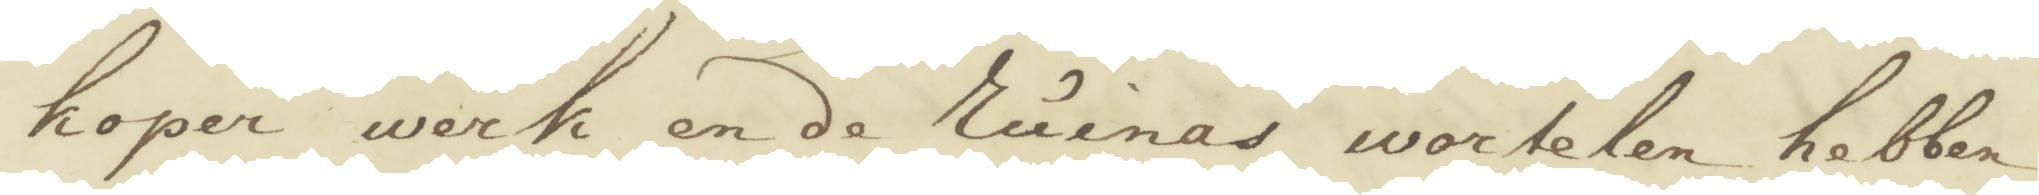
koper werk en de ruinas wortelen hebben
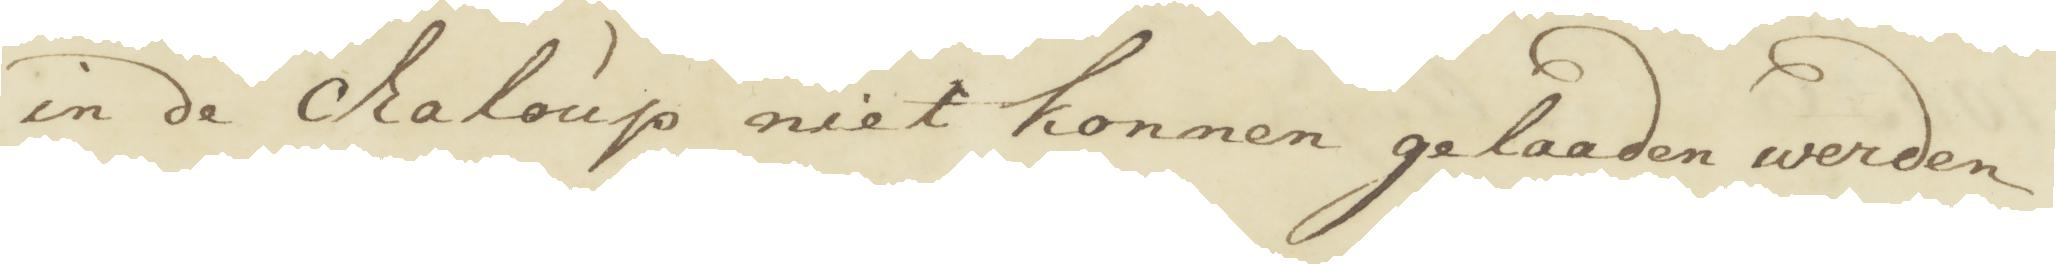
in de chaloup niet konnen gelaaden werden
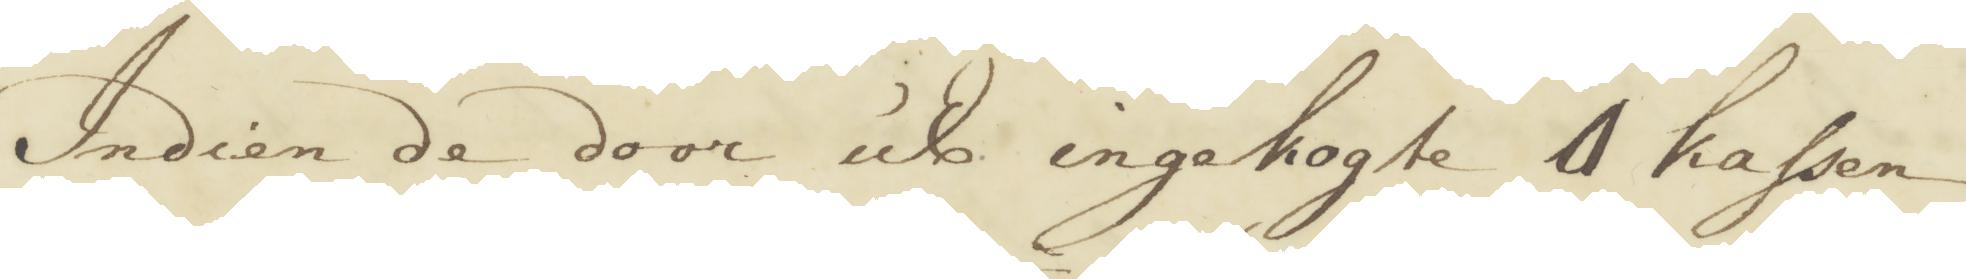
Indien de door uE ingekogte 4 kassen
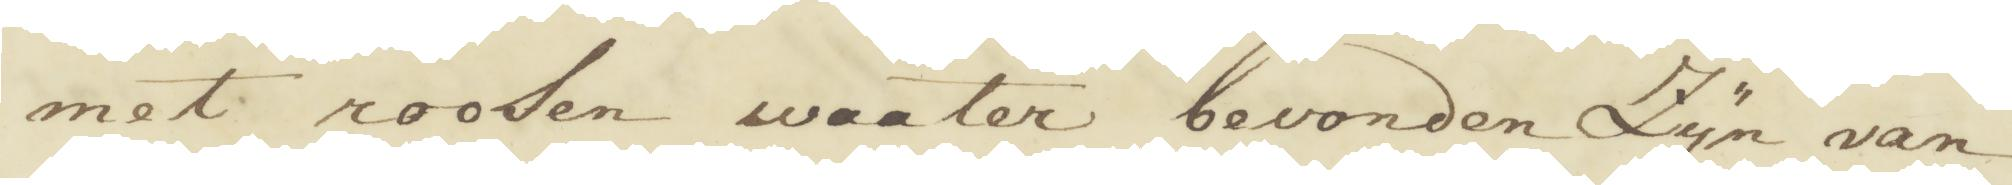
met roosen waater bevonden zijn van
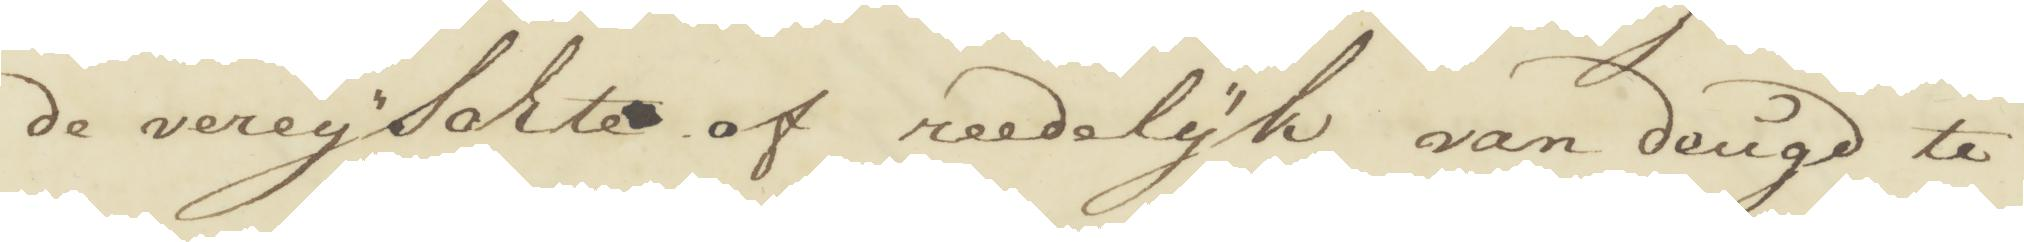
de vereijschte of reedelijk van deugd te
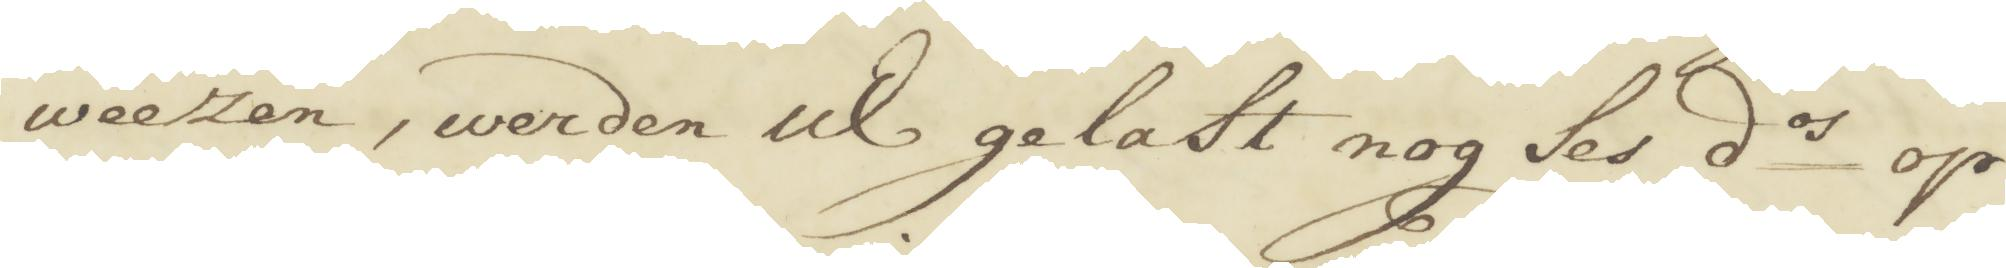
weezen, werden uE gelast nog ses d=os op
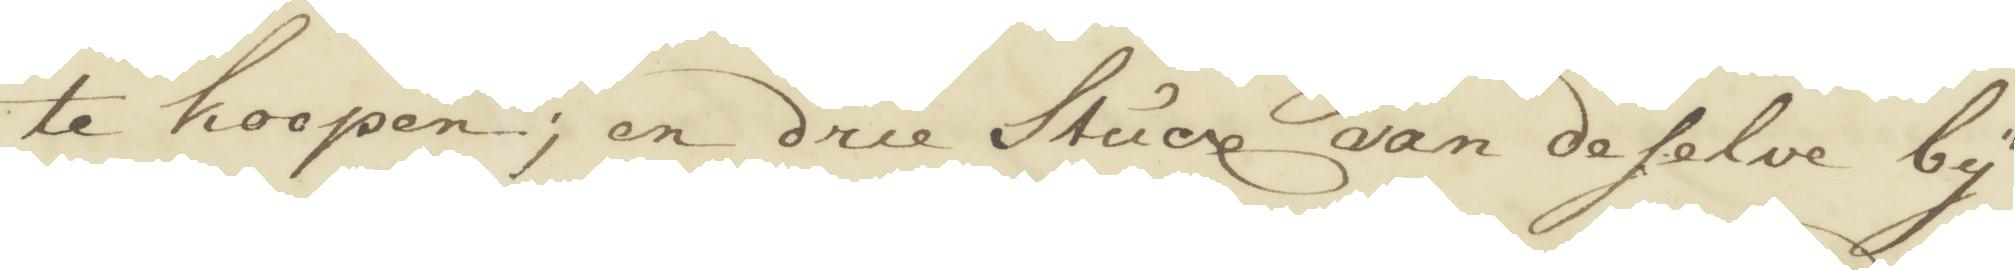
te koopen; en drie stucx van deselve bij
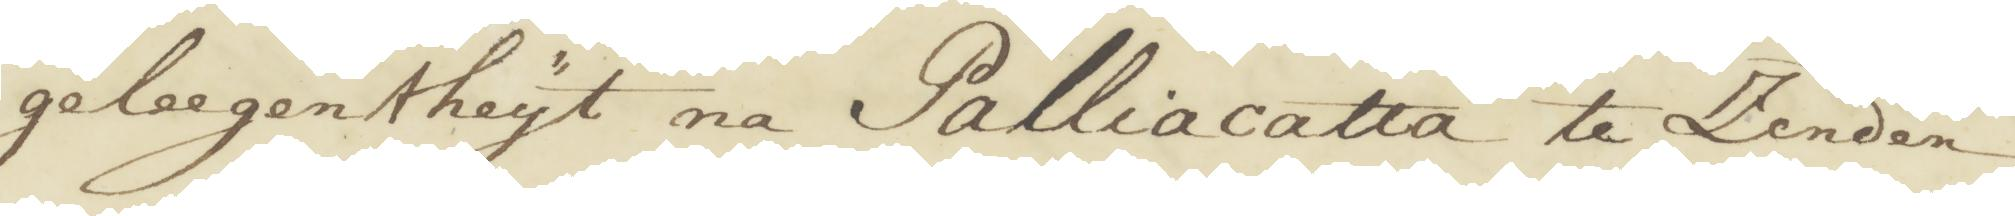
geleegentheijt na Palliacatta te zenden
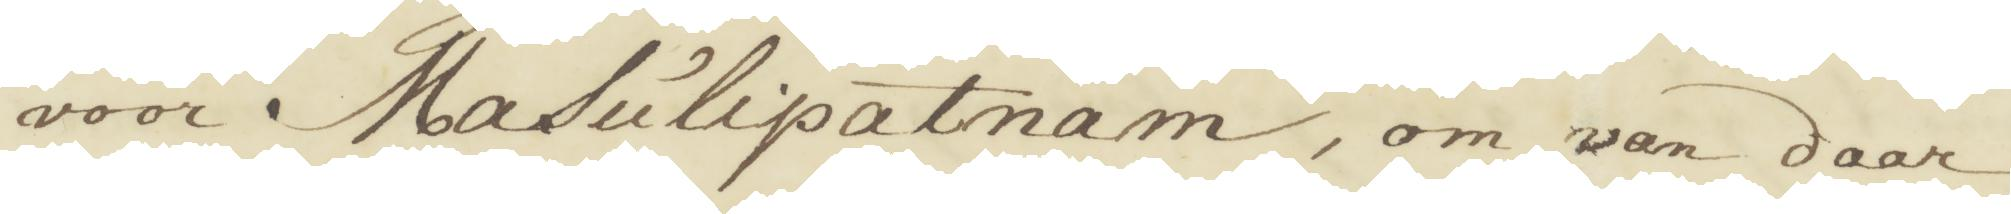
voor Masulipatnam, om van daar
